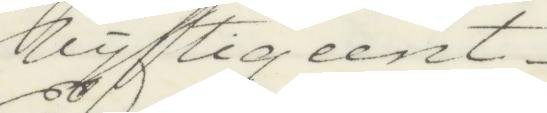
vijftig cent
